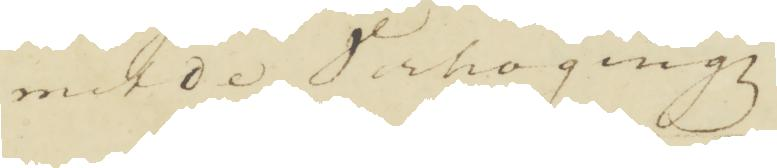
met de Verhogingen
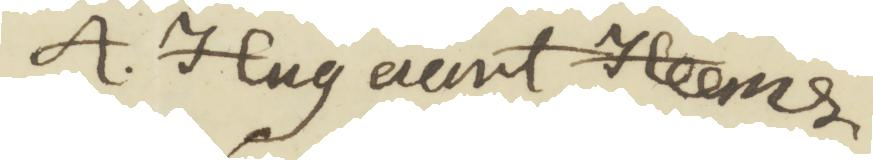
A: Hugaart Heems
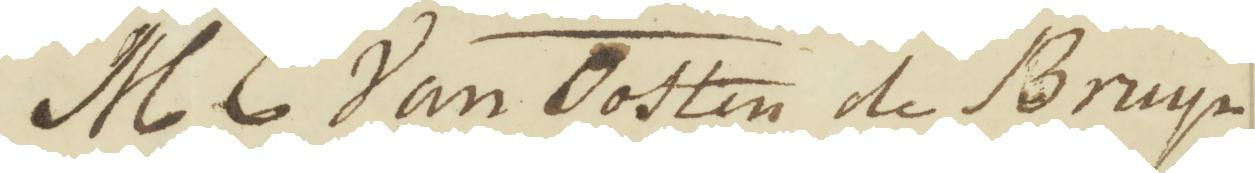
M C Van Oosten de Bruyn
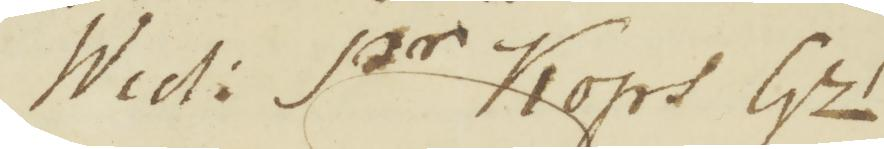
Wed: Pr Kops Gz
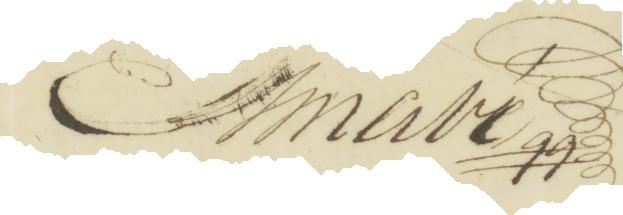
Maré qq
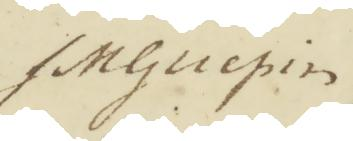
JMGuepin
